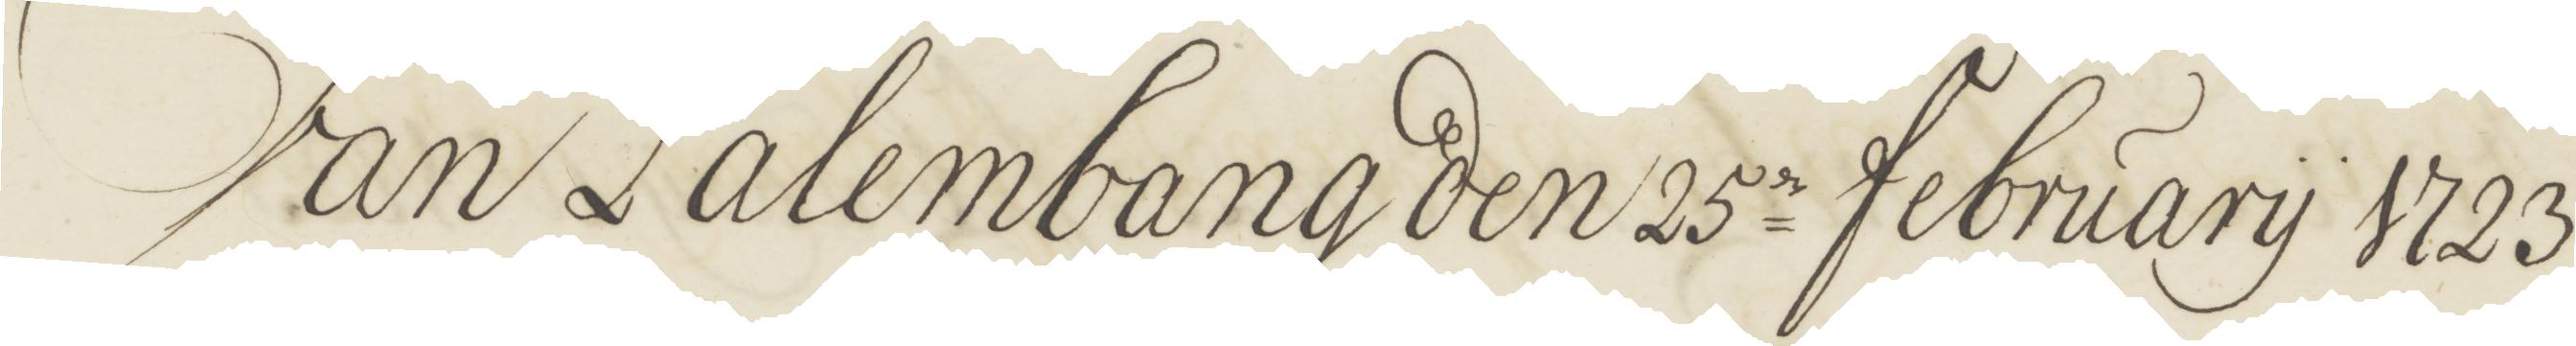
Van Palembang den 25=en februarij 1723
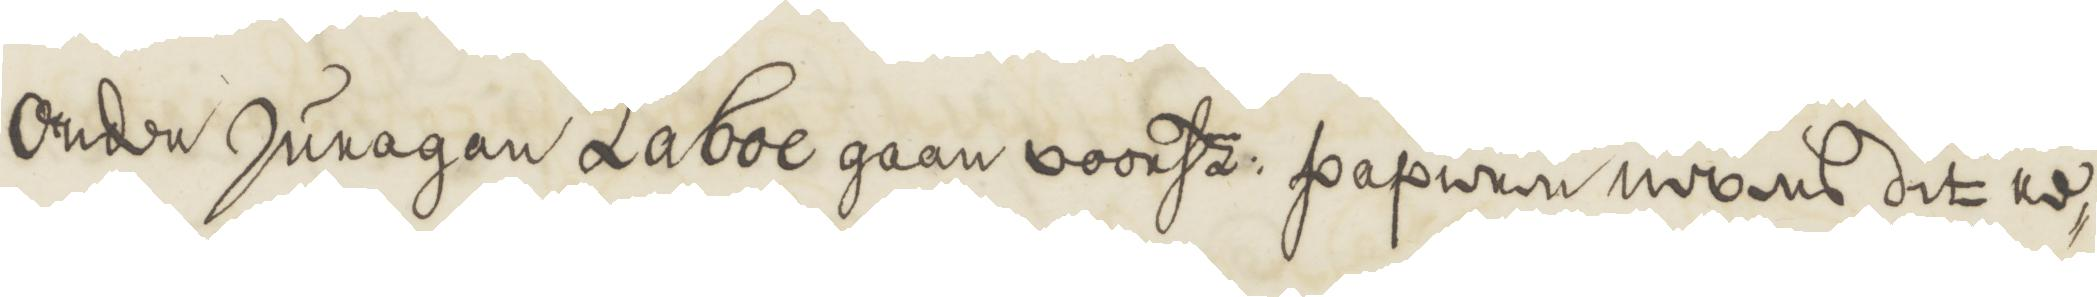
Ouder Juragan Laboe gaan voorsz: papieren nevens dit re„
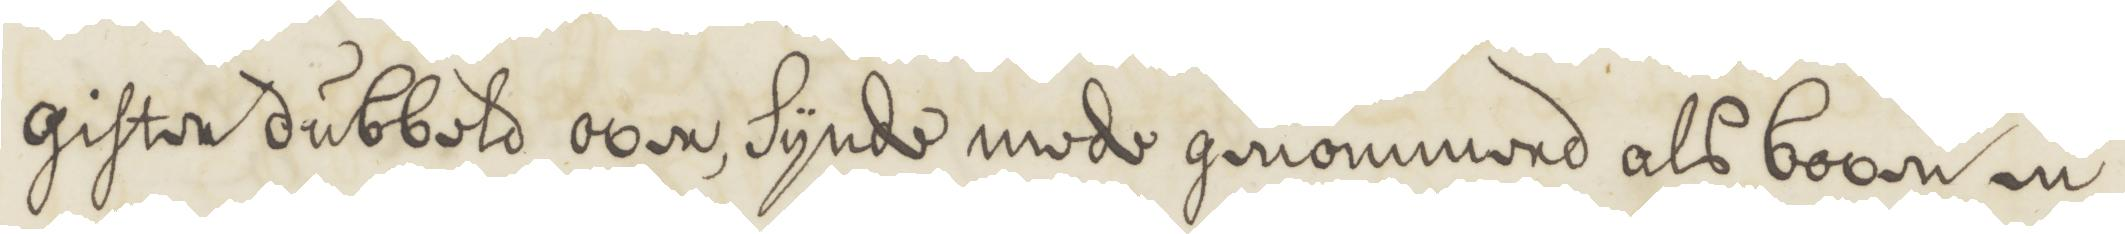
gister dubbeld over, sijnde mede genommerd als boven en
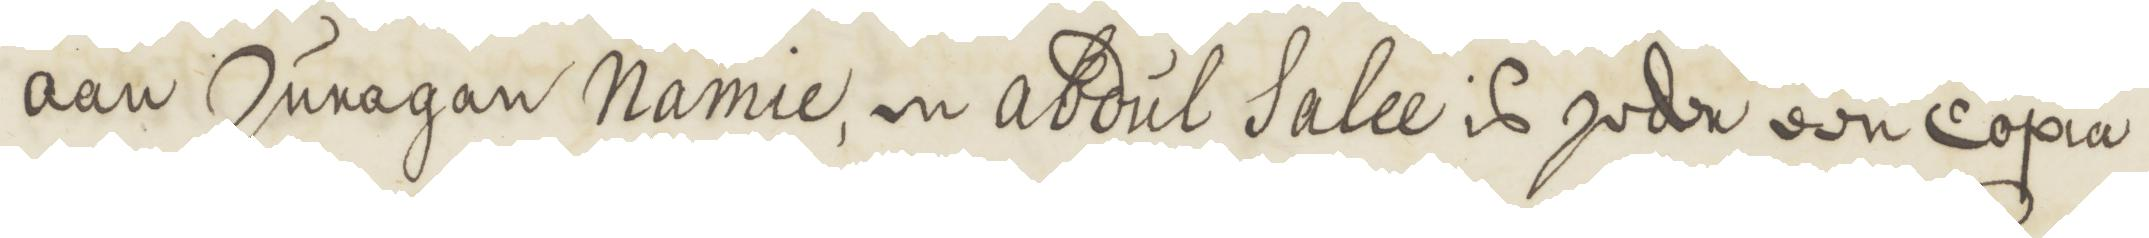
aan Juragan Namie, en abdul salee is jeder een copia
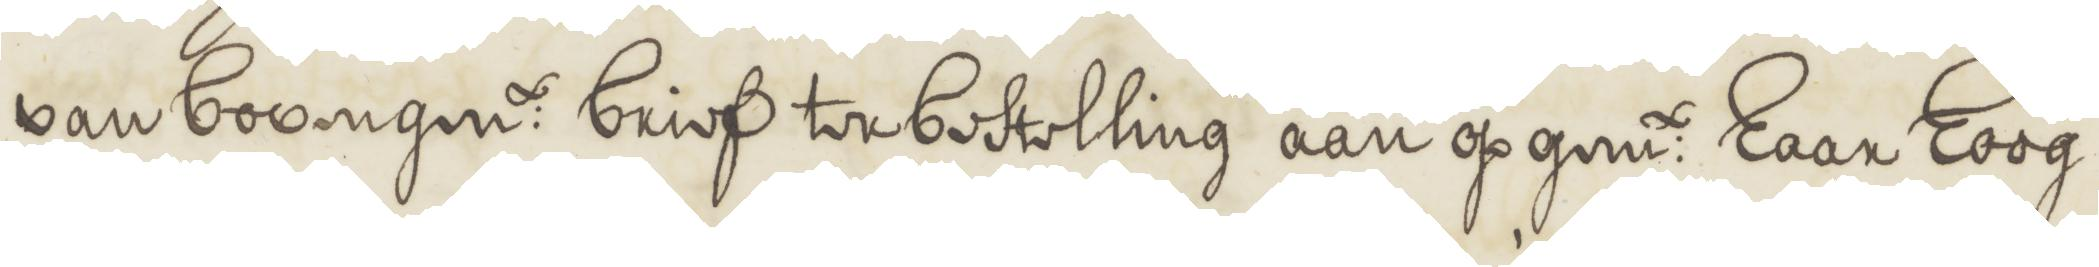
van bovengen: brief ter bestelling aan op gem: haar hoog
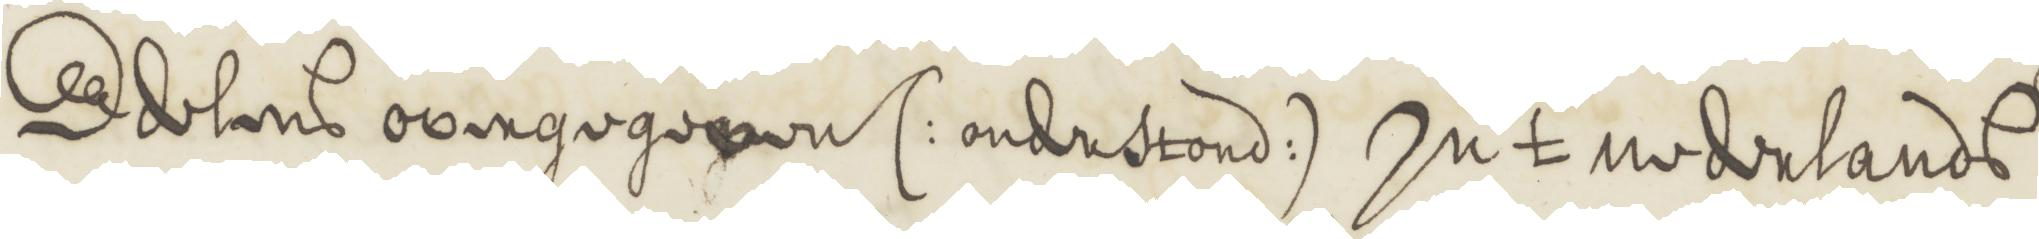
Edelens overgegeven (:onderstond:) jn’t nederlands
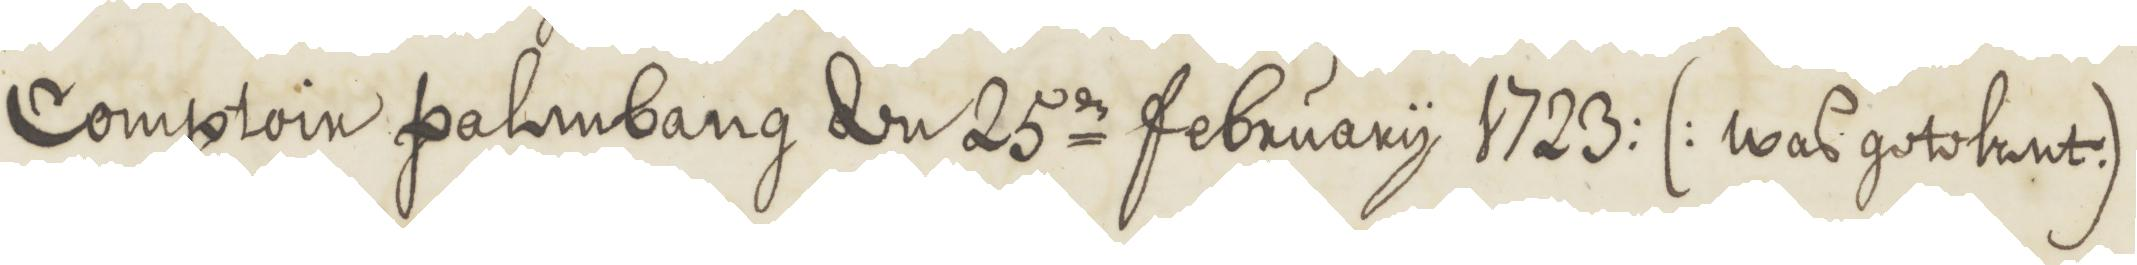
Comptoir palembang den 25=en februarij 1723: (: was getekent:)
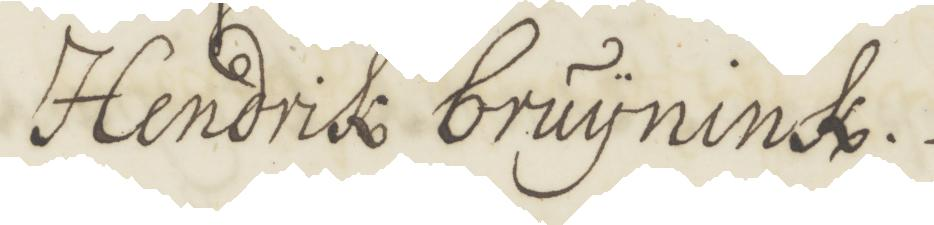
Hendrik bruijnink. —
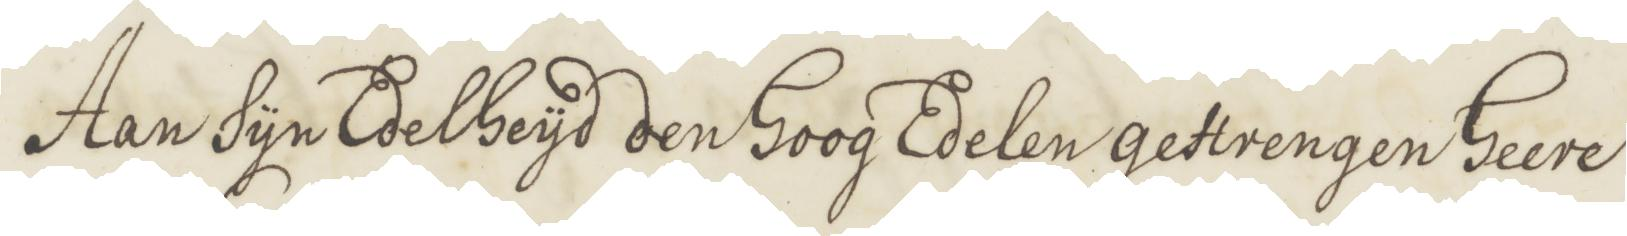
Aan sijn Edelheijd den Hoog Edelen gestrengen Heere
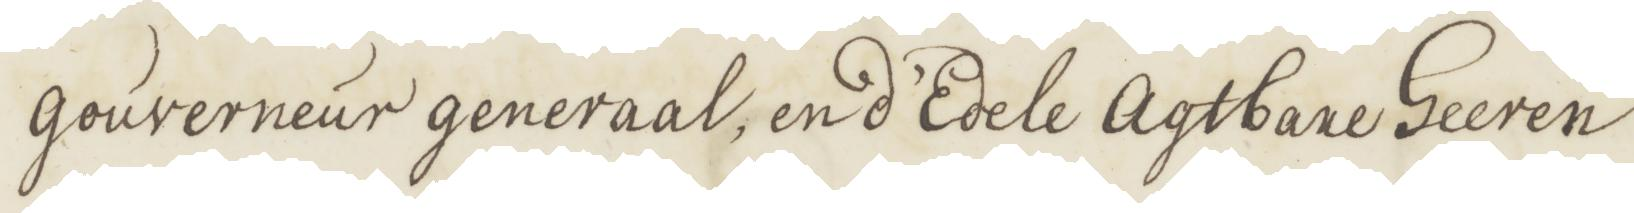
gouverneur generaal, en d’Edele Agtbare Heeren
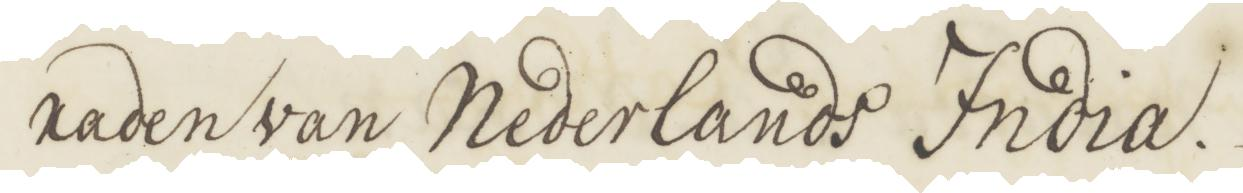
raden van Nederlands India. —
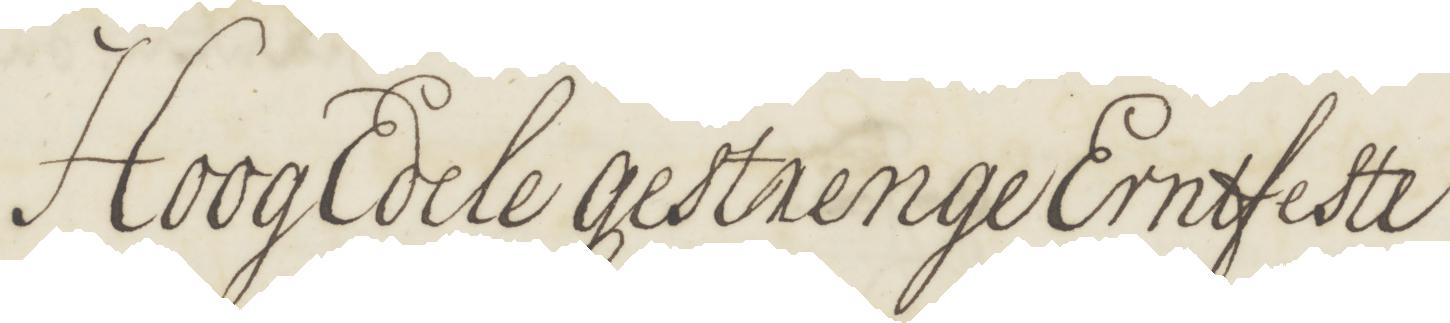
Hoog Edele gestrenge Erntfeste
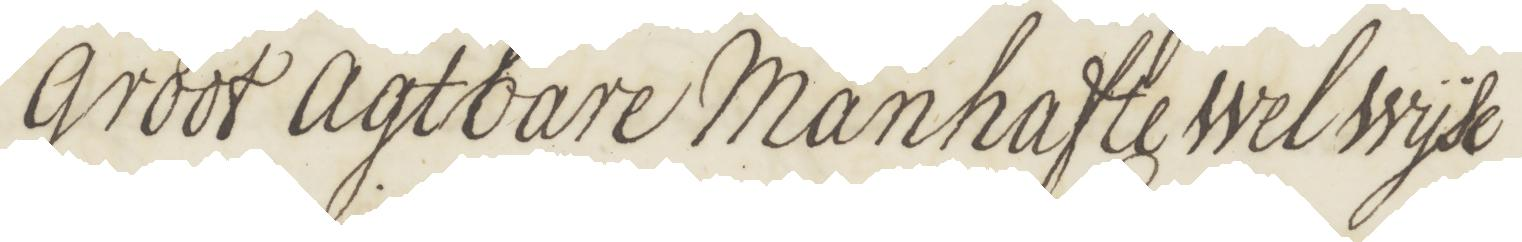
Groot Agtbare Manhafte wel wijse
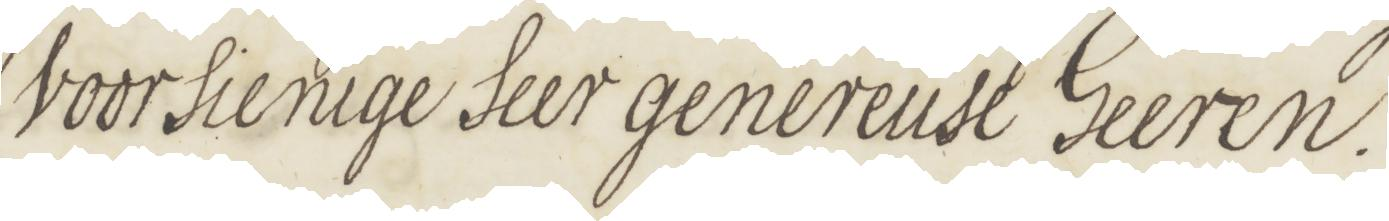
voor sienige seer genereuse Heeren.
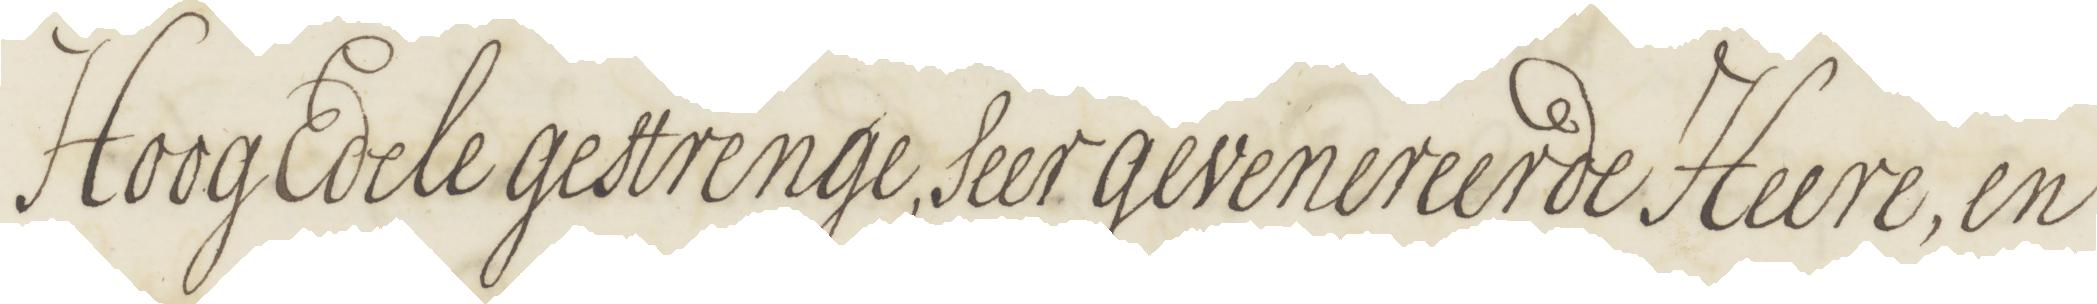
Hoog Edele gestrenge, seer gevenereerde Heere, en
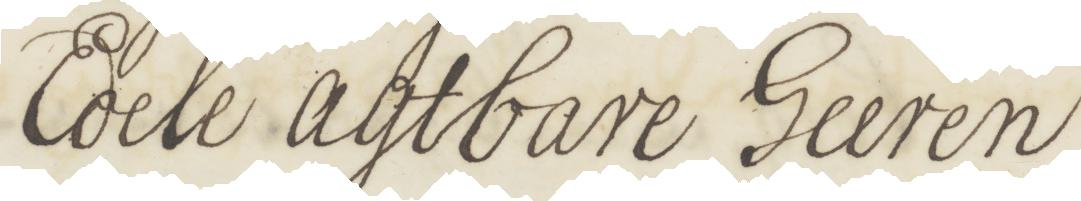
Edele agtbare Heeren
